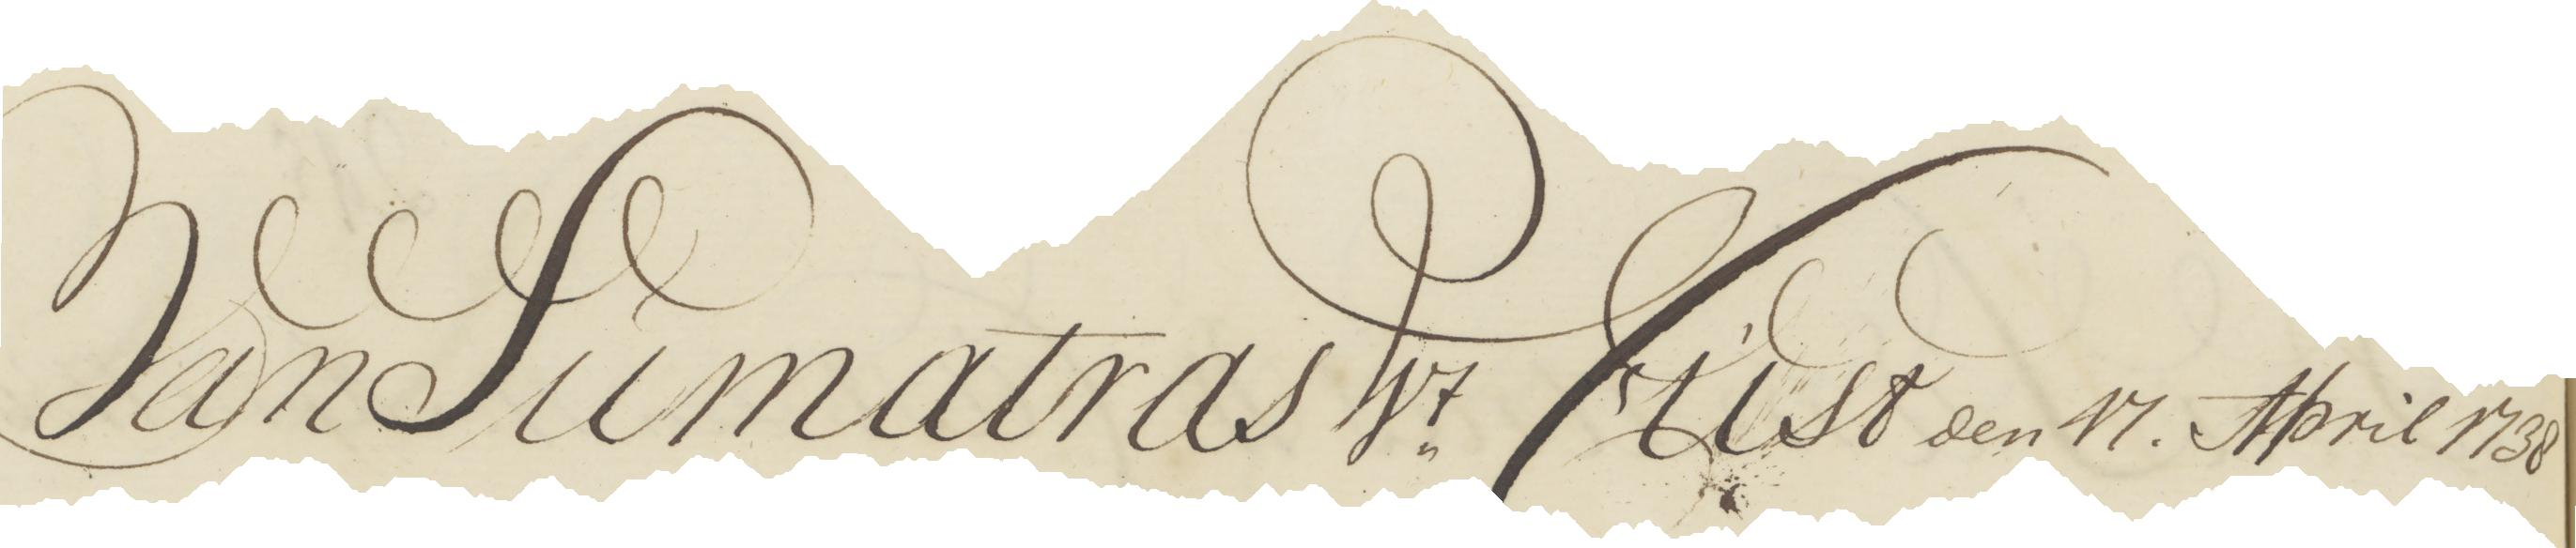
Van Sumatras W„t Cust den 17. April 1738
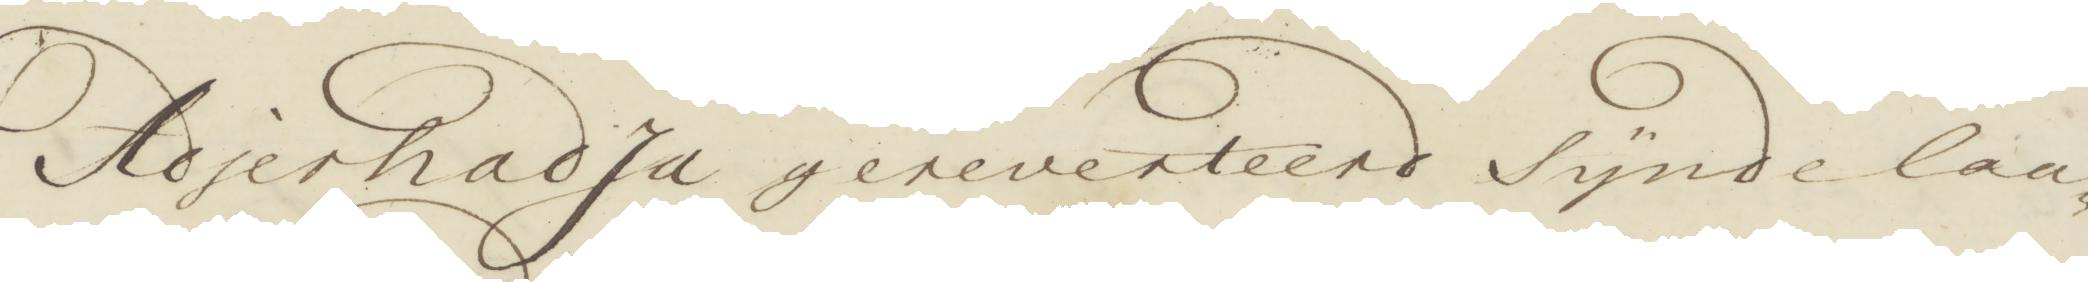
Adjerhadja gereverteerd sijnde laa„
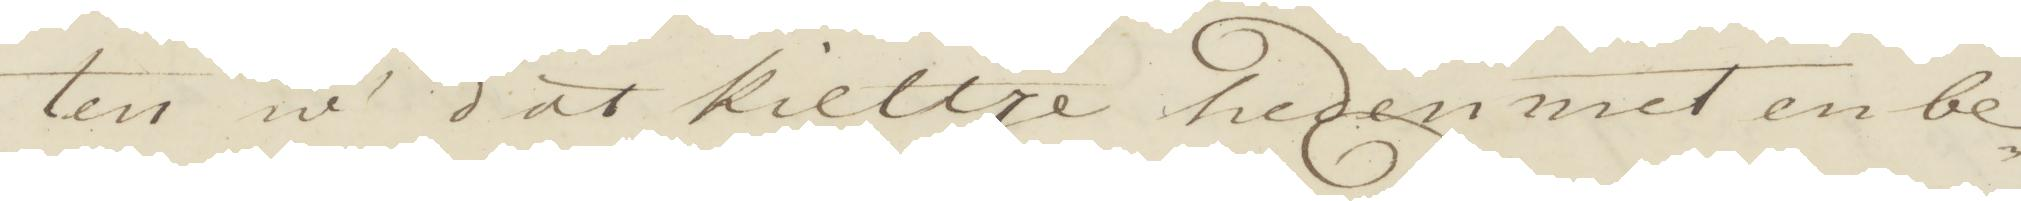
ten in dat kieltje heden met en be„
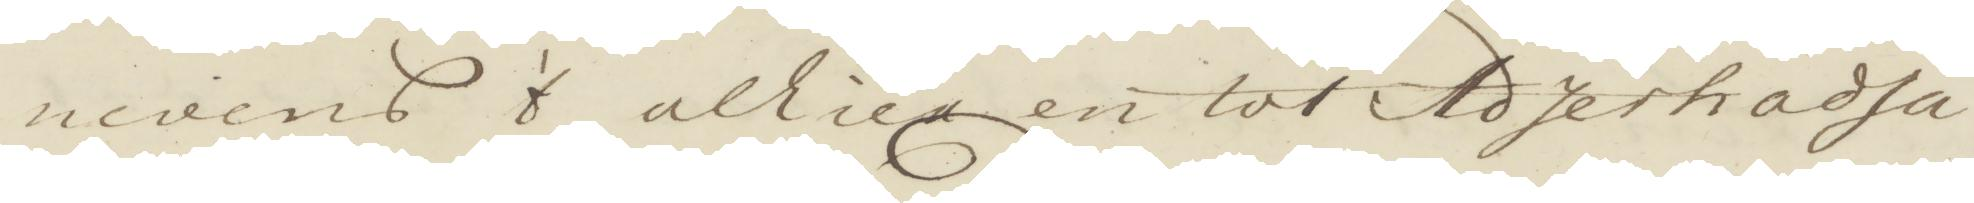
nevens 't alhier en tot Adjerhadja
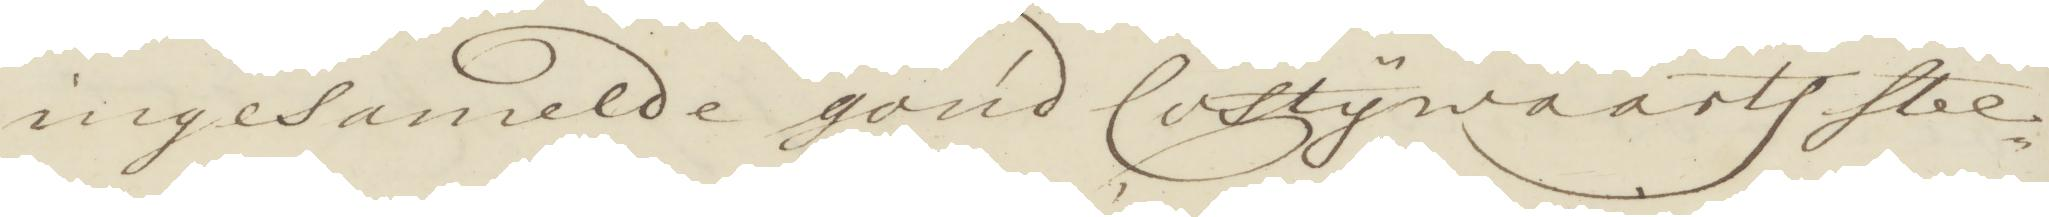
ingesamelde goud Costijwaarts stee„
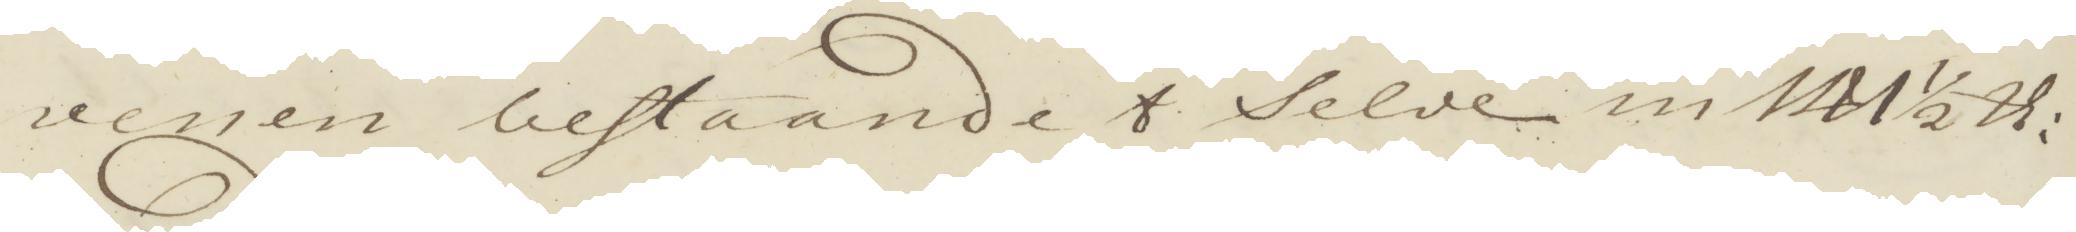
venen bestaande 't selve in 141½ lb:
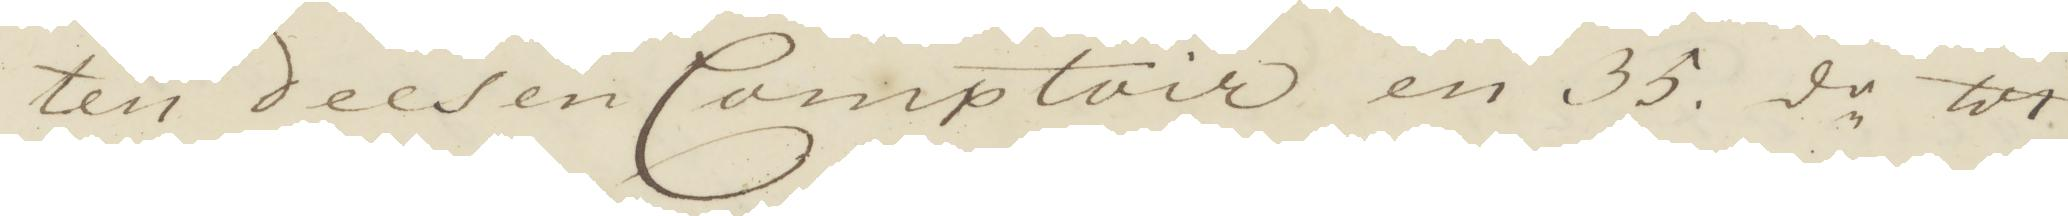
ten deesen Comptoir en 35. d„r tot
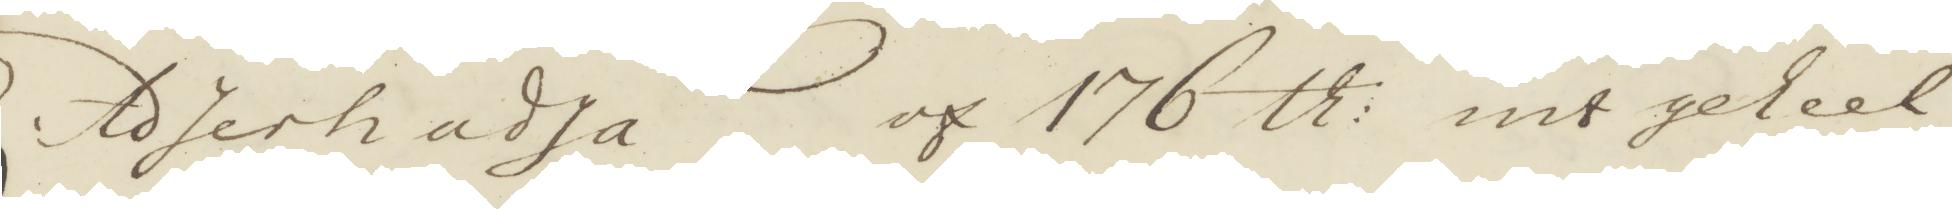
Adjerhadja, of 176 lb: int geheel
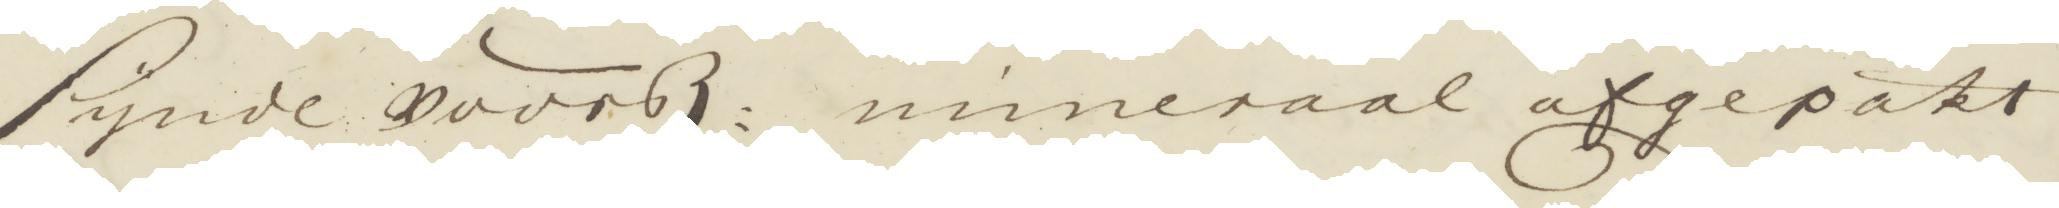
Sijnde voorsz: mineraal afgepakt
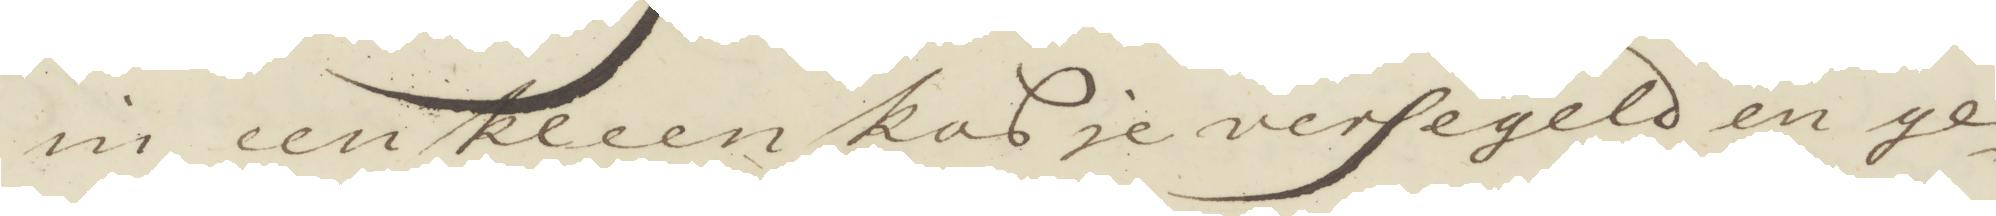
in een kleen kasje versegeld en ge„
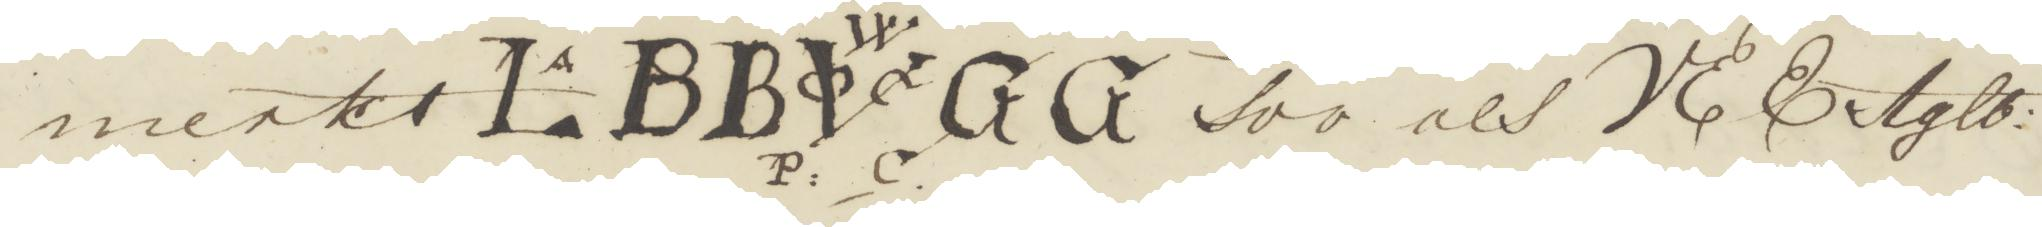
merkt LA BB P: VOCW C. GG soo als VE EAgtb:
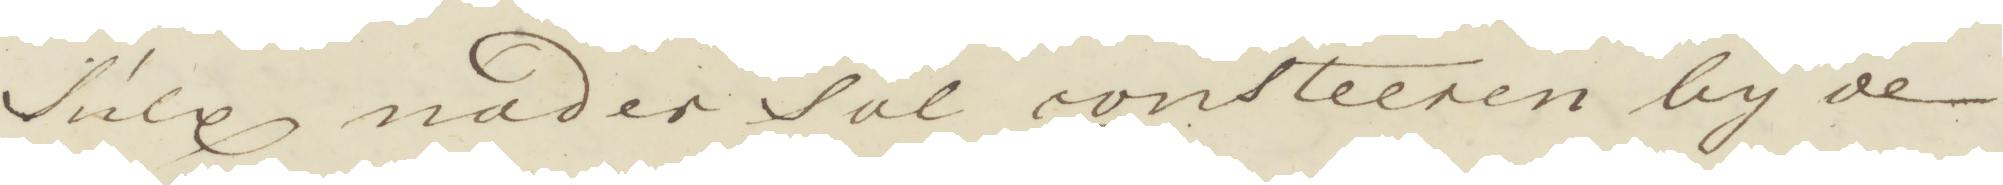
sulx nader sal consteeren bij de
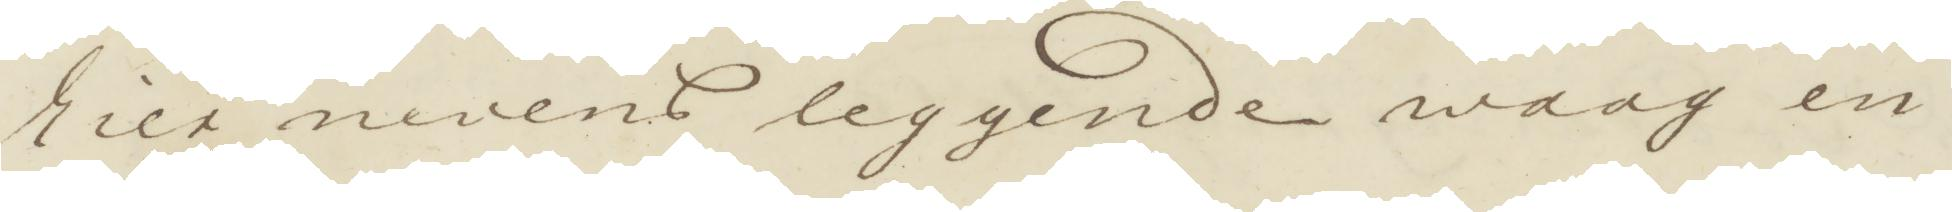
hier nevens leggende waag en
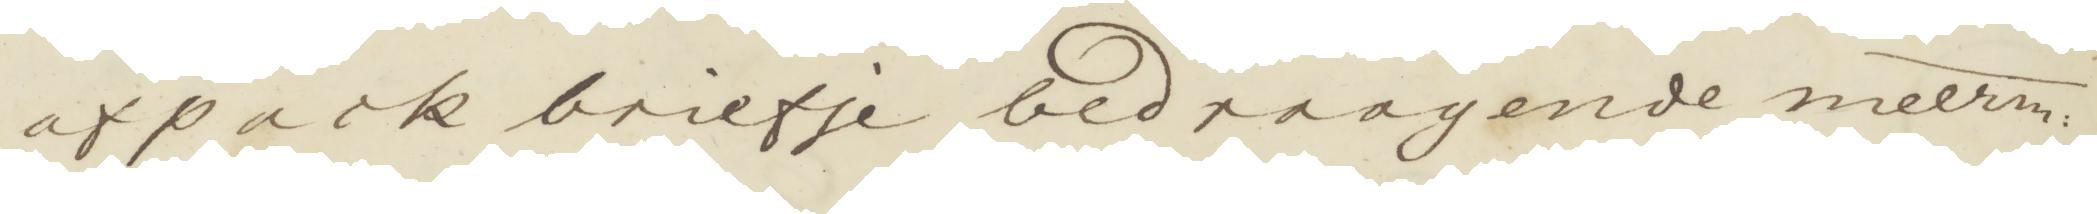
afpack briefje bedraagende meerm:
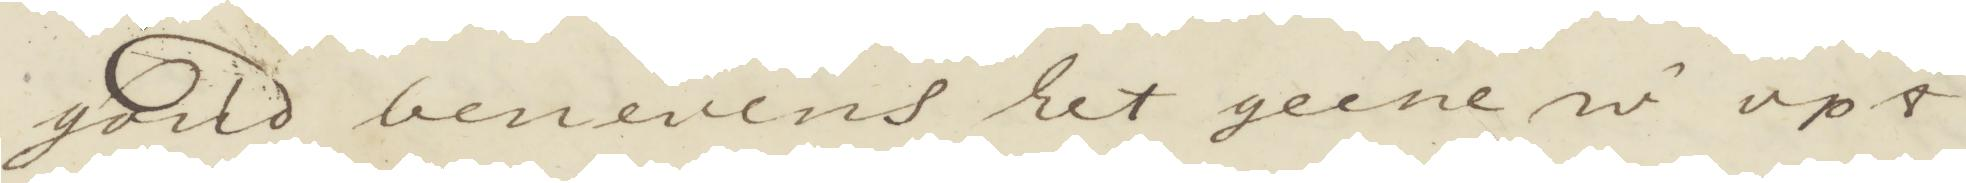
goud benevens het geene w' op 't
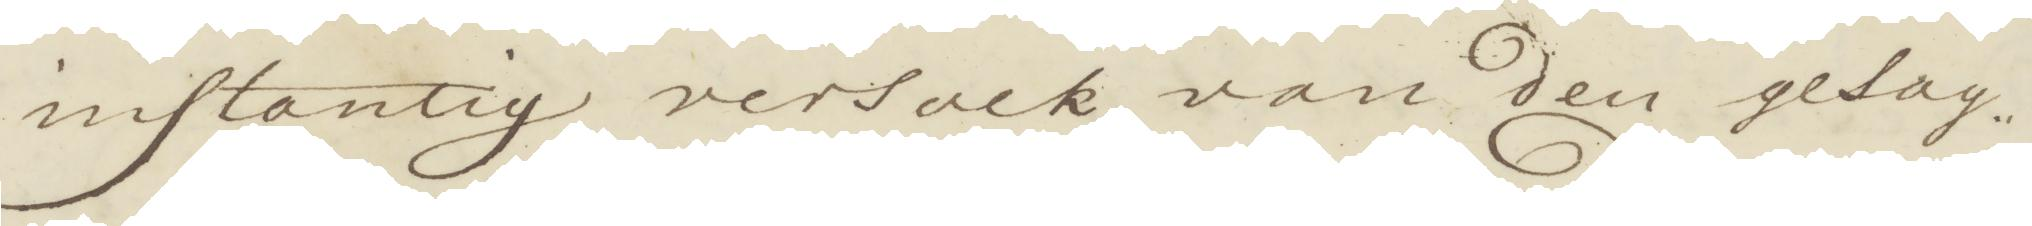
instantig versoek van den gesag„
